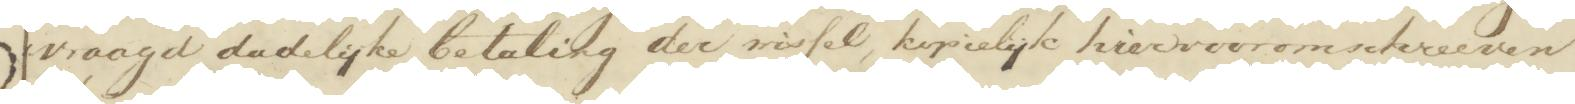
vraagd dadelijke betaling der wissel, kopielijk hier vooromschreeven
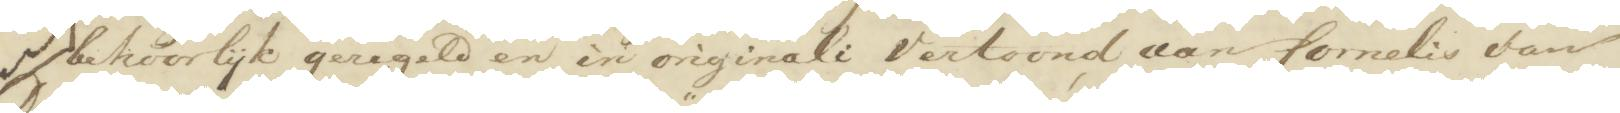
behoorlijk geregeld en in originali vertoond aan Cornelis van
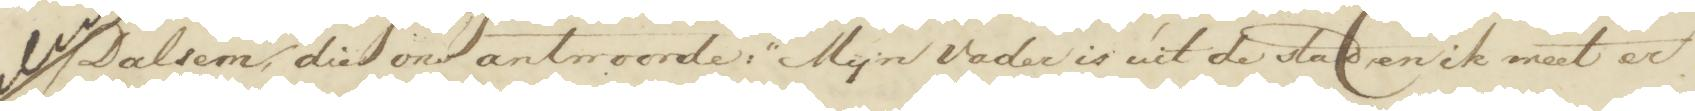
Dalsem, die ons antwoorde: "Mijn vader is uit de stad, en ik weet er
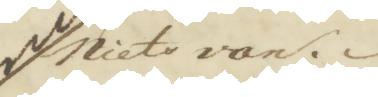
niets van.
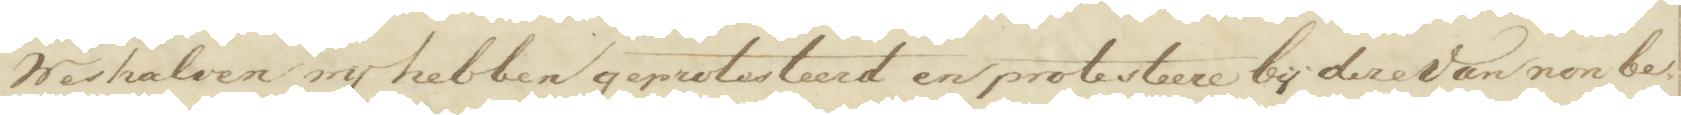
Weshalven wy hebben geprotesteerd en protesteere bij deze van non be
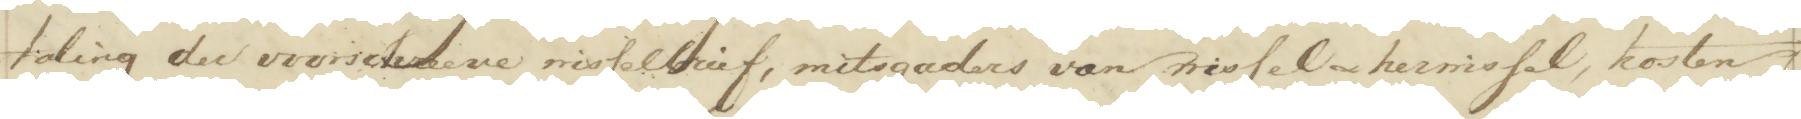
taling der voorschreeve wisselbrief, mitsgaders van wissel & herwissel, kosten
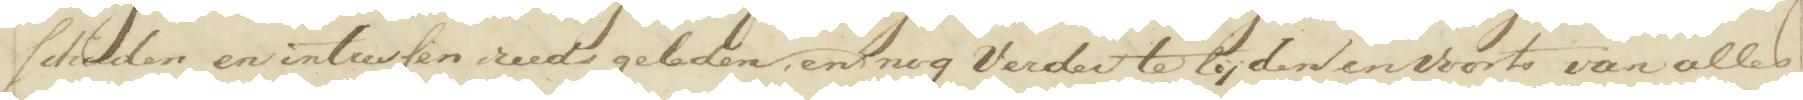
schaden en intussen reeds geleden, en nog verder te lijden en voorts van alles
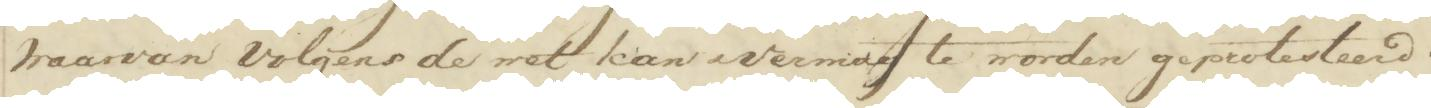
waarvan volgens de wet kan & vermag te worden geprotesteerd
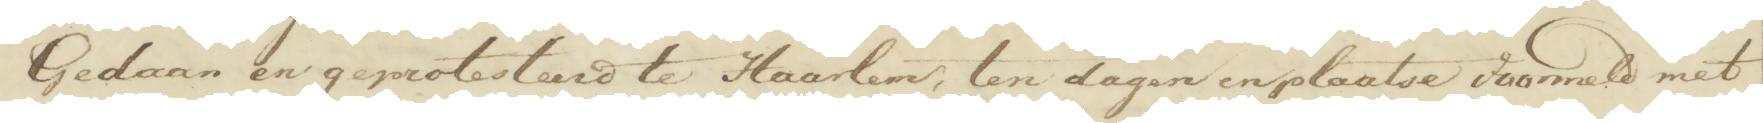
Gedaan en geprotesteerd te Haarlem, ten dagen en plaatse voormeld met
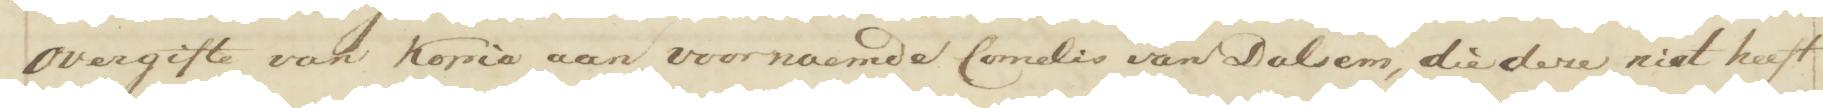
overgifte van kopie aan voornoemde Cornelis van Dalsem, die deze niet heeft
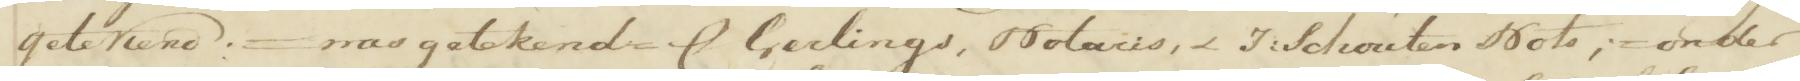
getekend. =was getekend= C Gerlings, Notaris, & I: Schouten Nots; =onder
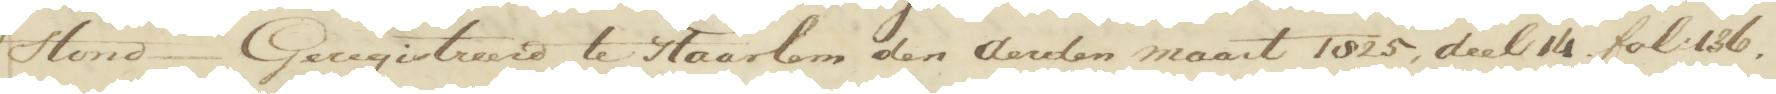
stond= Geregistreerd te Haarlem den derden maart 1825, deel 14 fol-o 136,
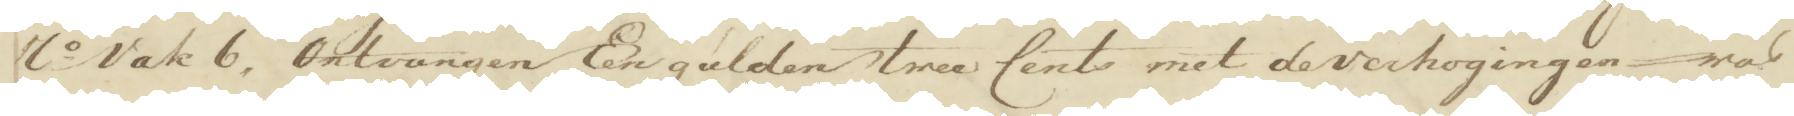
r-o Vak 6, Ontvangen Een gulden twee Cents met de verhogingen =was
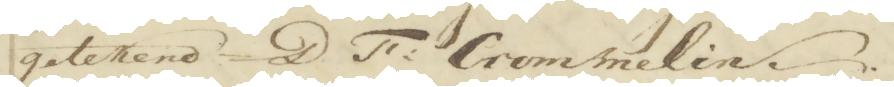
getekend = D F: Crommelin
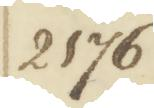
2176
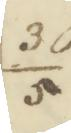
3/5
